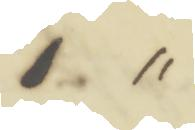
1. „
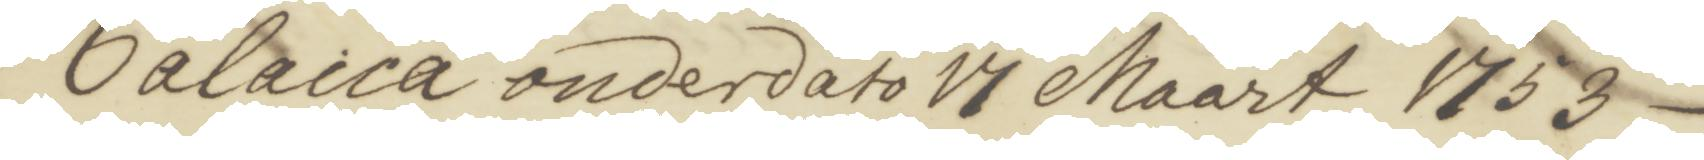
Malacca onderdato 17 Maart 1753
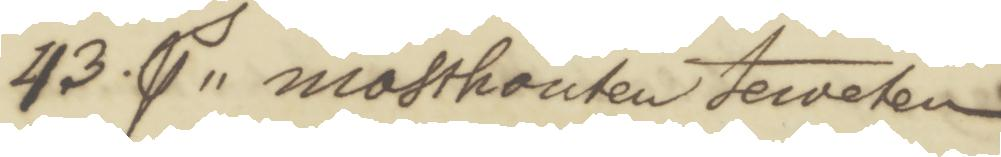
43. p„s mosthouten teweten
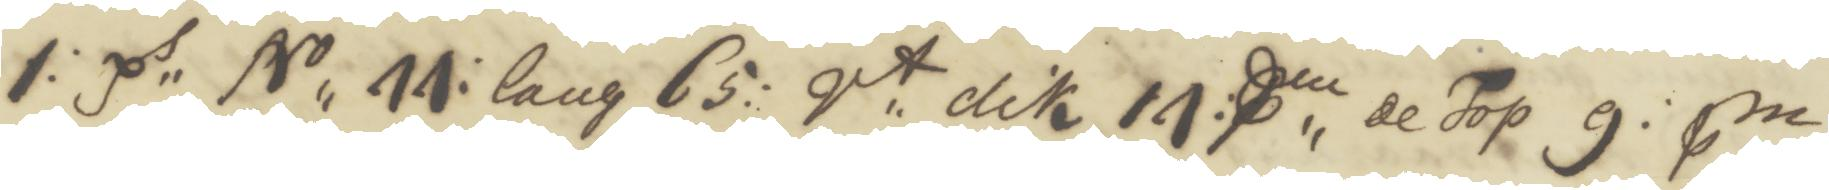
1: p„s N„o 44: lang 65: v„t dik 14. p„m de top 9: p.m
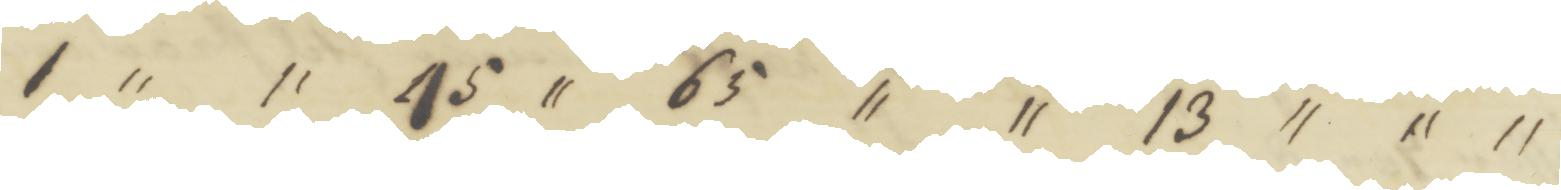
1 „ „ 45 „ 65 „ „ 13 „ „ „
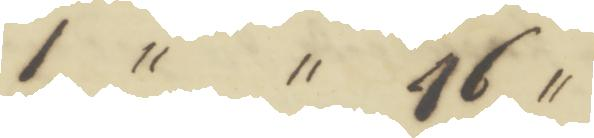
1 „ „ 46 „
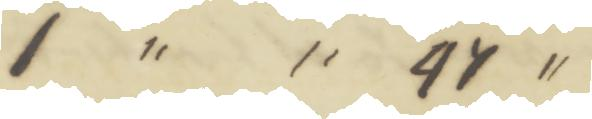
1 „ „ 47 „
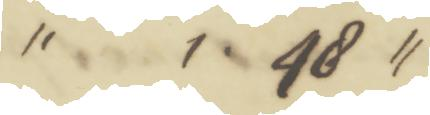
„ 1. 48 „
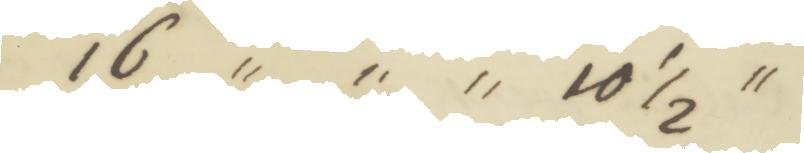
16 „ „ „ 10 ½ „
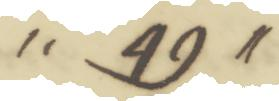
„ 49 „
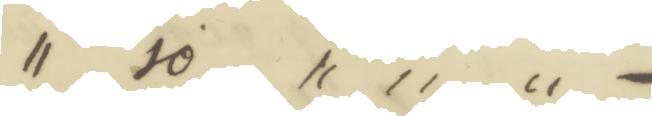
„ 10 „ „ „ —
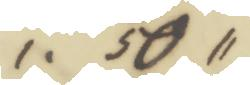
50 „
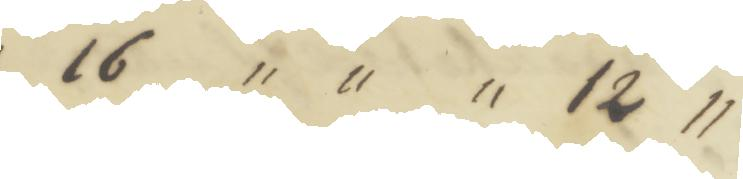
16 „ „ „ 12 „
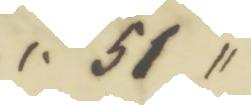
„ 51 „
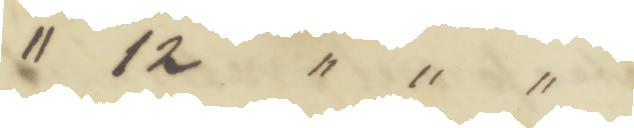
1 12 „ „ „
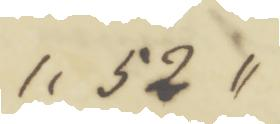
„ 52 „
